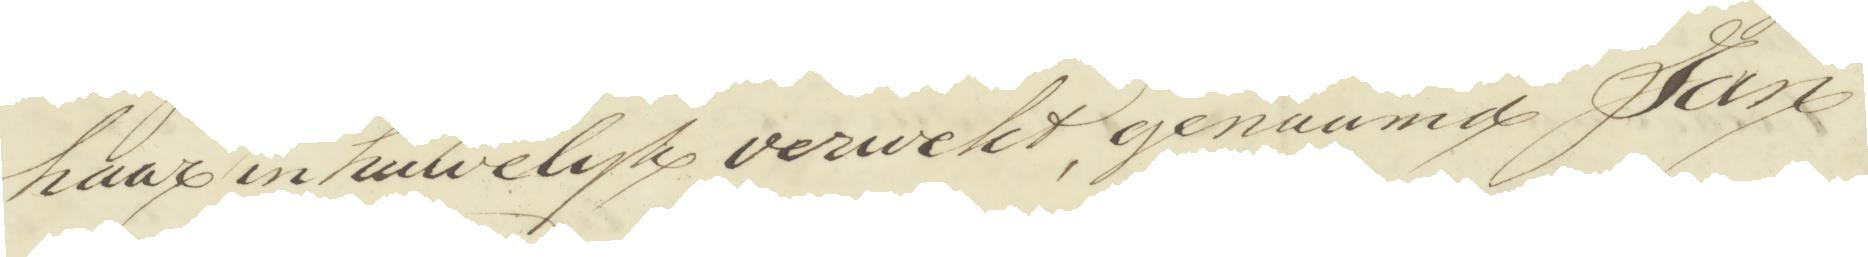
haar in huwelyk verwekt genaamd Jan
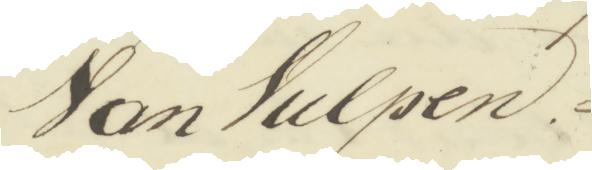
Van Vulpen
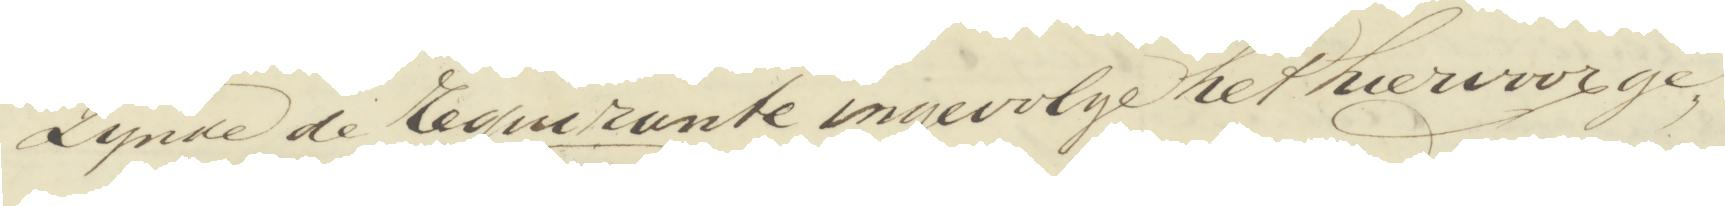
Zynde de Requirante ingevolge het hiervoor ge„
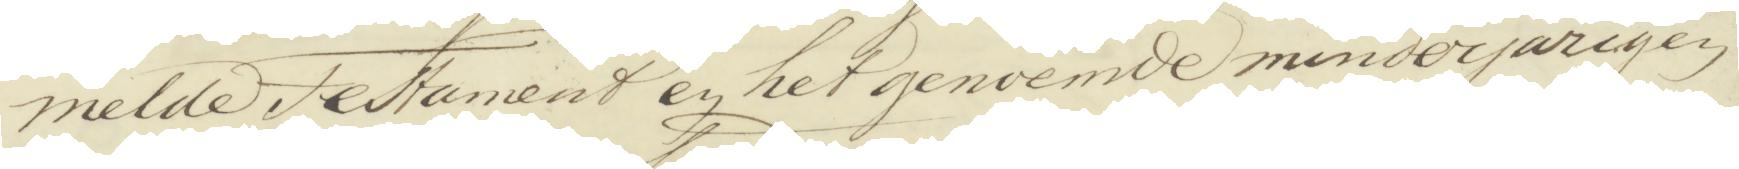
melde Testament en het genoemde minderjarigen
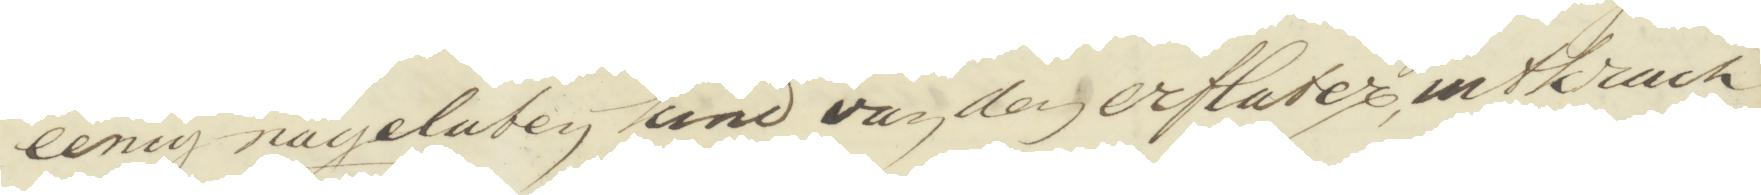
eenig nagelaten kind van den erflater uitkrach
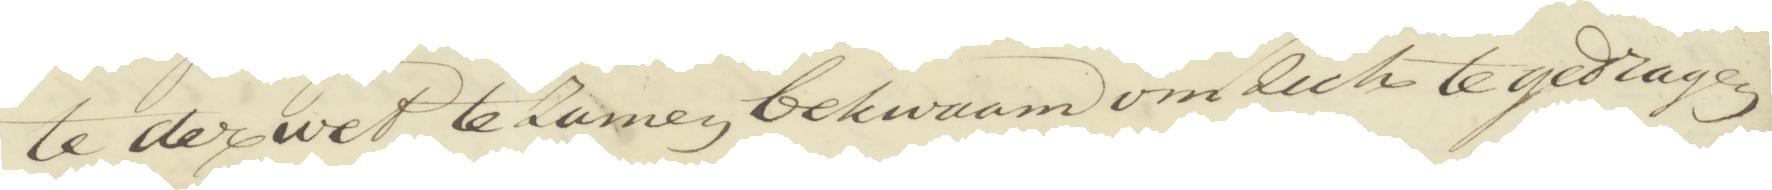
te der wet te Zamen bekwaam om zich te gedragen
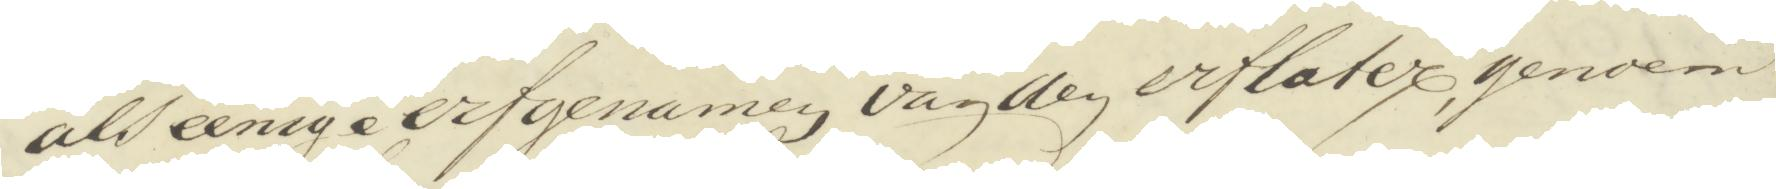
als eenige erfgenamen van den erflater, genoem
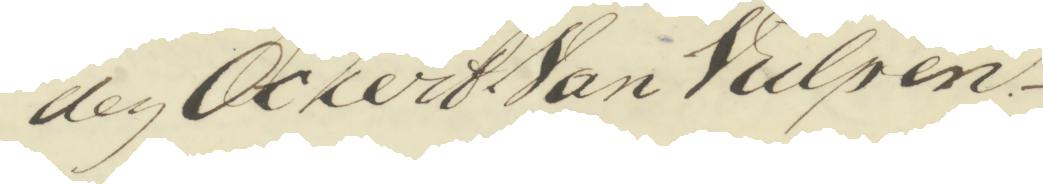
den Ockert van Vulpen.
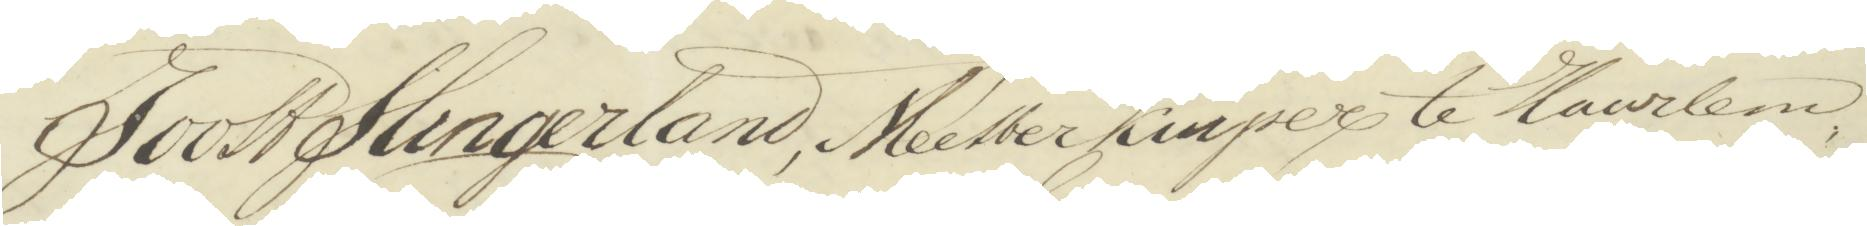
Joost Slingerland, Meester kuiper te Haarlem,
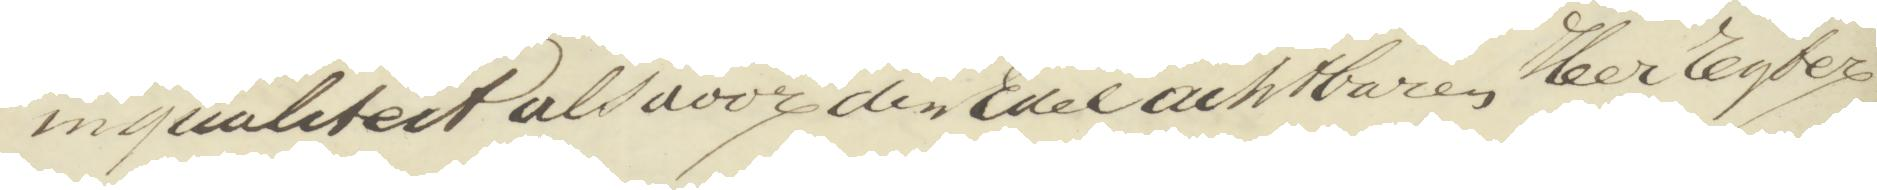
in qualiteit als door den Edel achtbaren Heer Regter
